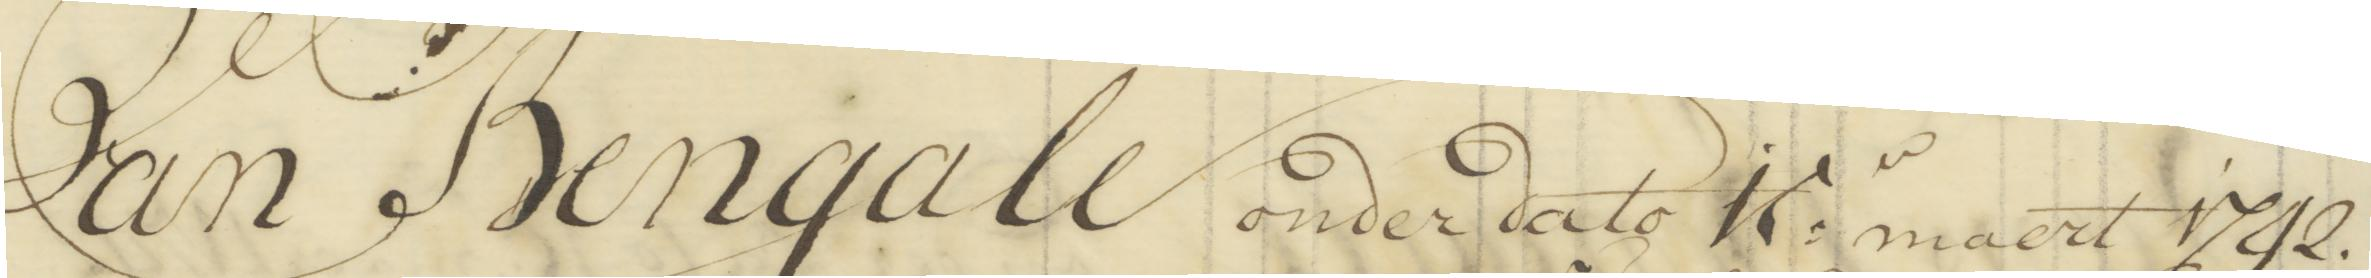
Van Bengale onder dato 15:e maert 1742.
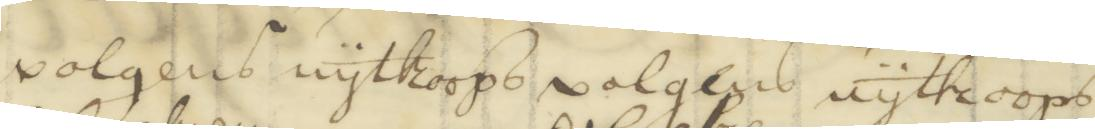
volgens uijtkoops volgens uijtkoops
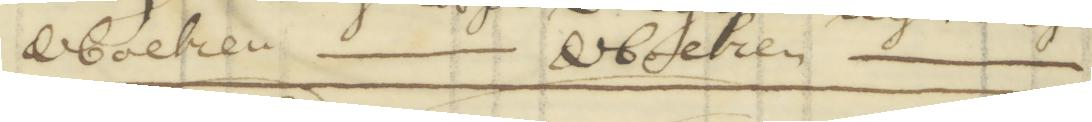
deboeken — deboeken —
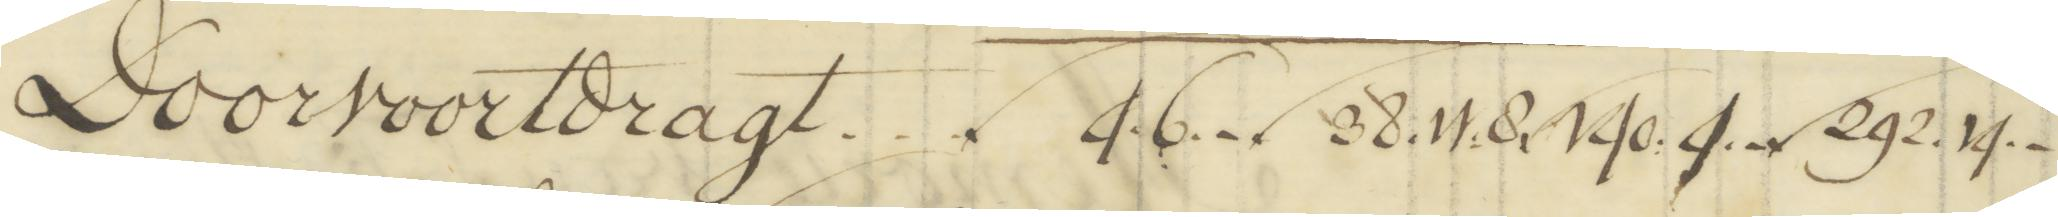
Door voortdragt ƒ 4. 6. - ƒ 38. 11. 8 ƒ 140: 4. - ƒ 292. 14. -
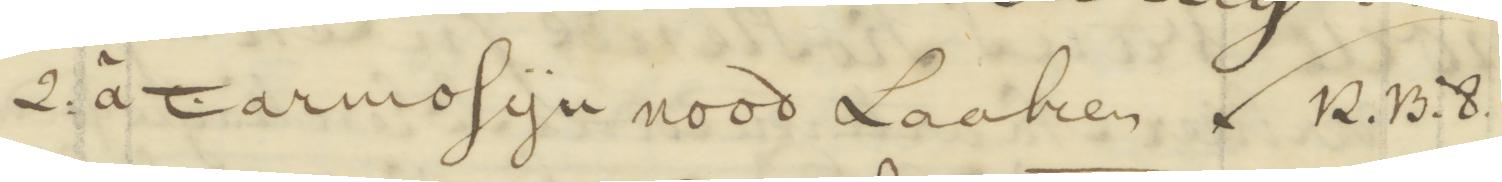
2: â carmosijn rood laaken ƒ 12. 13. 8.
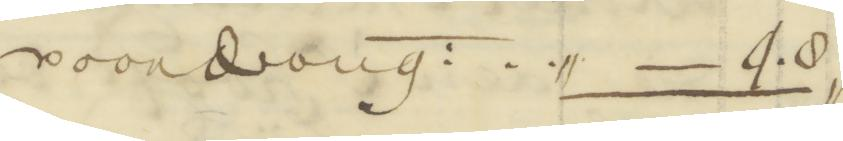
voor deong: . .„. — 4. 8
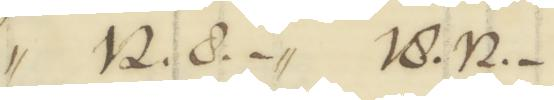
„ 12. 8. -„ 18. 12.-
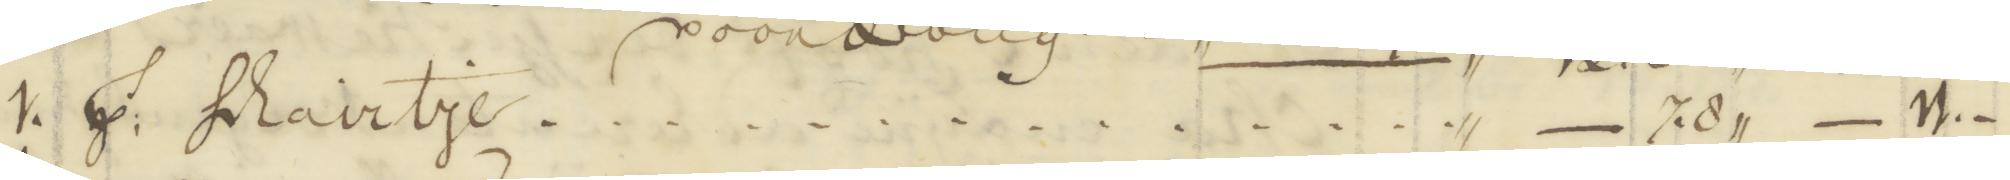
1. p:s schairtje . . . . . . . . . . . . . . „ — 7. 8 „ — 11. -
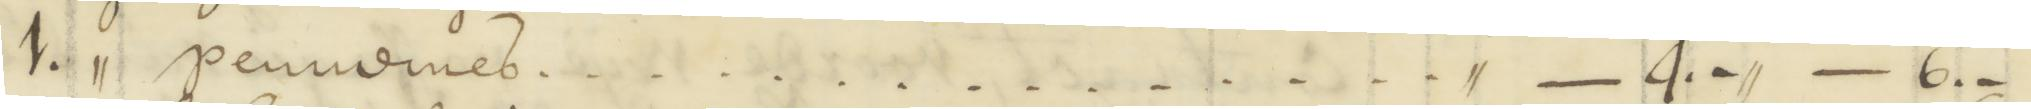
1. „ pennemes . . . . . . . . . . . . . . . „ — 4. -„ — 6. -
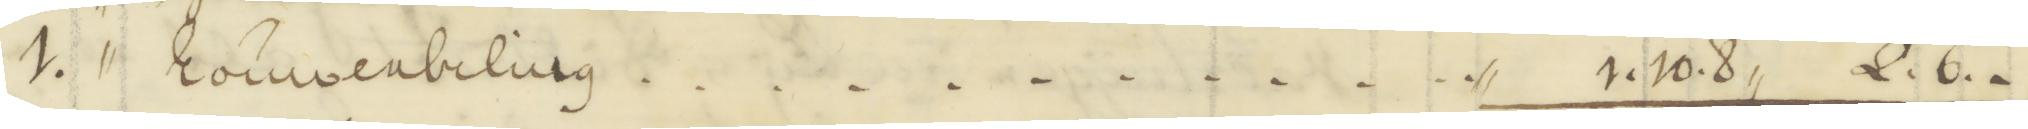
1. „ houwerkling . . . . . . . . . . . . „ 1. 10. 8 „ 2. 6. -
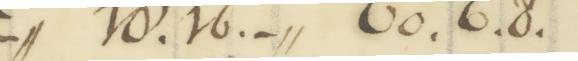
„ 18. 16. - „ 60. 6. 8.
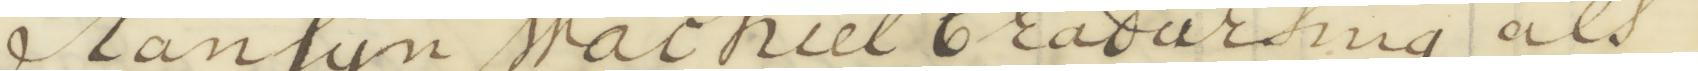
Aan sijn wackiel bhadursing als
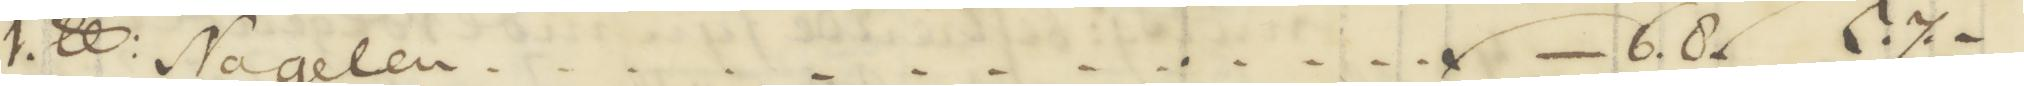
1. lb: Nagelen . . . . . . . . . . . . . ƒ — 6. 8 ƒ 5. 7. -
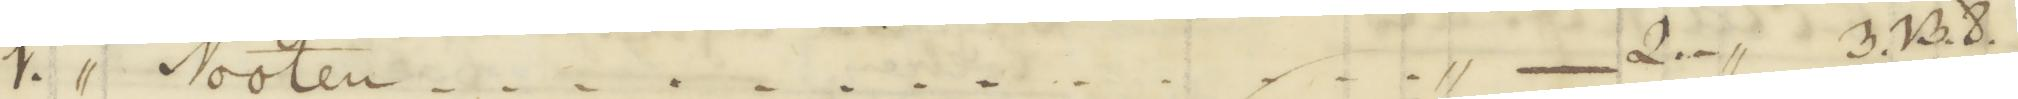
1. „ Nooten . . . . . . . . . . . . . „ — 2.- „ 3. 13. 8.
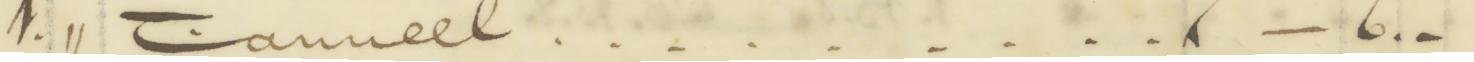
1. „ Canneel . . . . . . . . . ƒ — 6. -
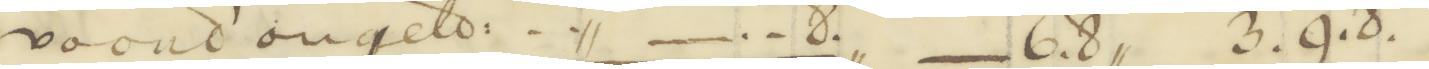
voor d' ongeld: - „ —. - 8. „ _ 6. 8 „ 3. 9. 8.
